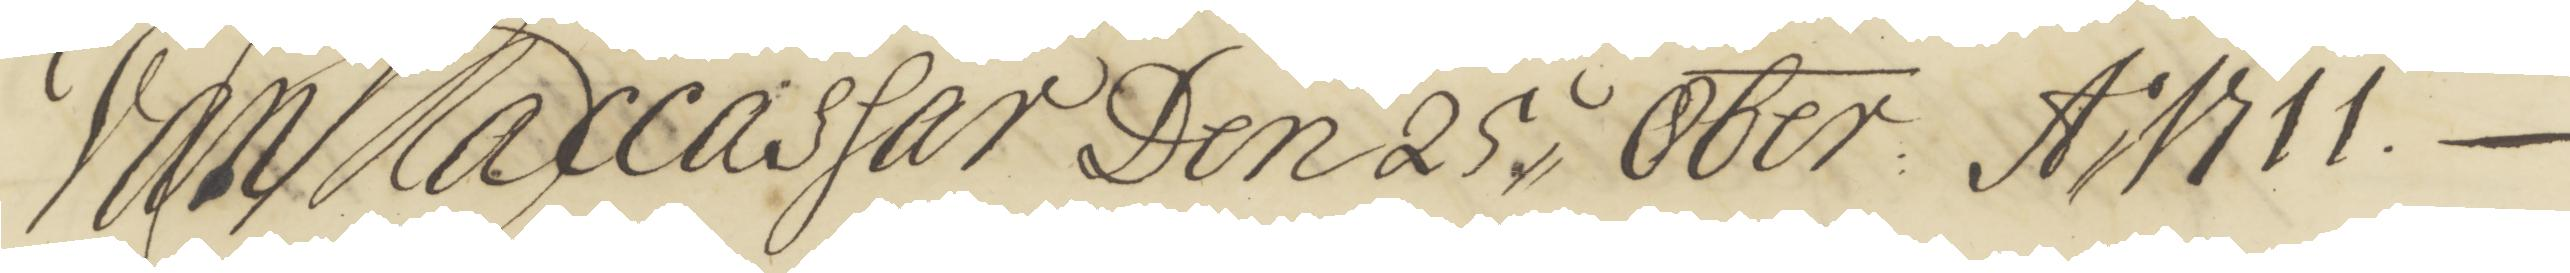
Van Maccassar Den 25„e 8ber: A„o 1711. —
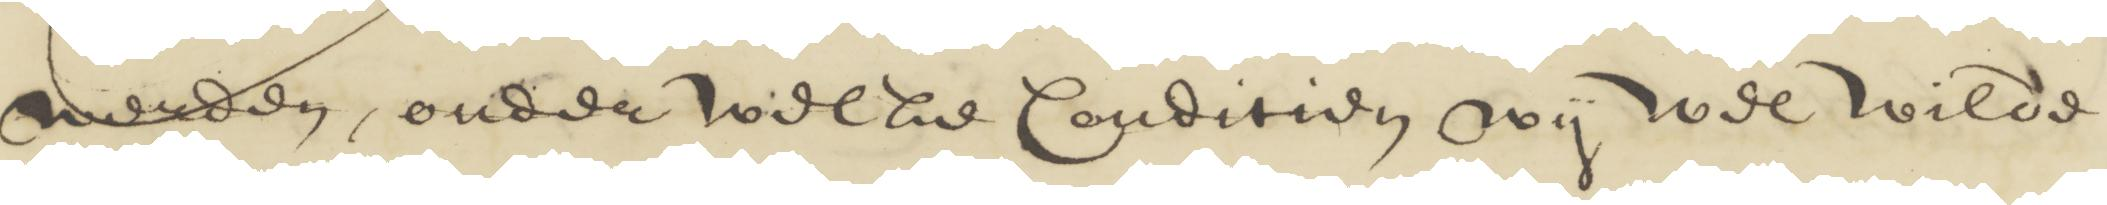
werden, onder welke Conditien wij wel wilde
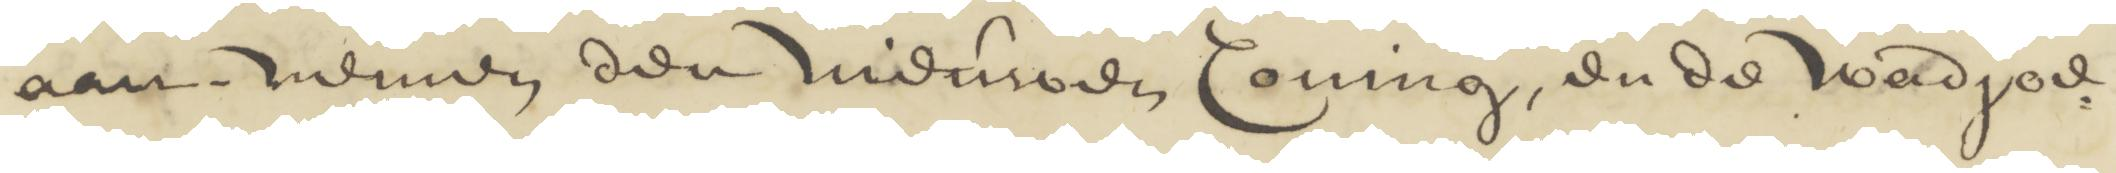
aan-nemen den nieuwen Coning, en de wadjoe:
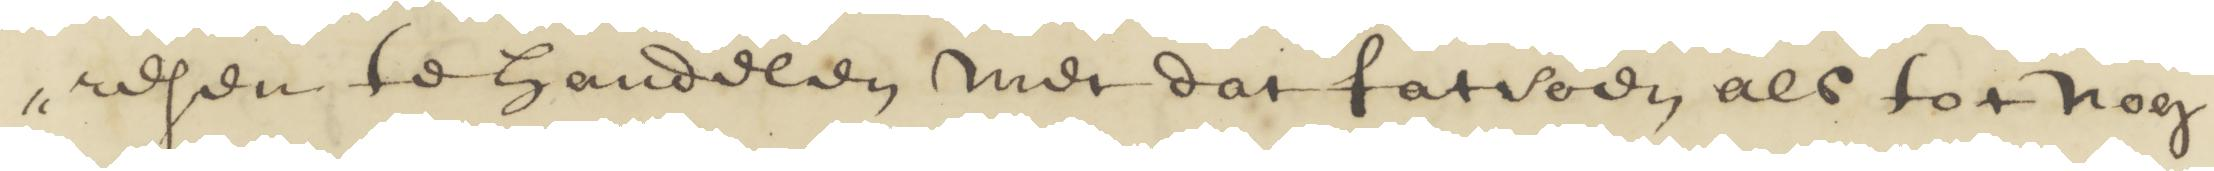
„resen te handelen met dat fatsoen als tot nog
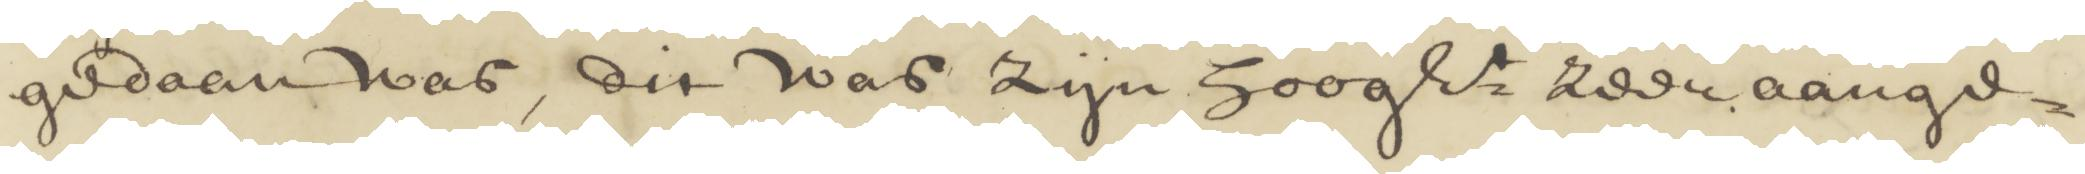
gedaan was, dit was zijn hoogh=t zeer aange=
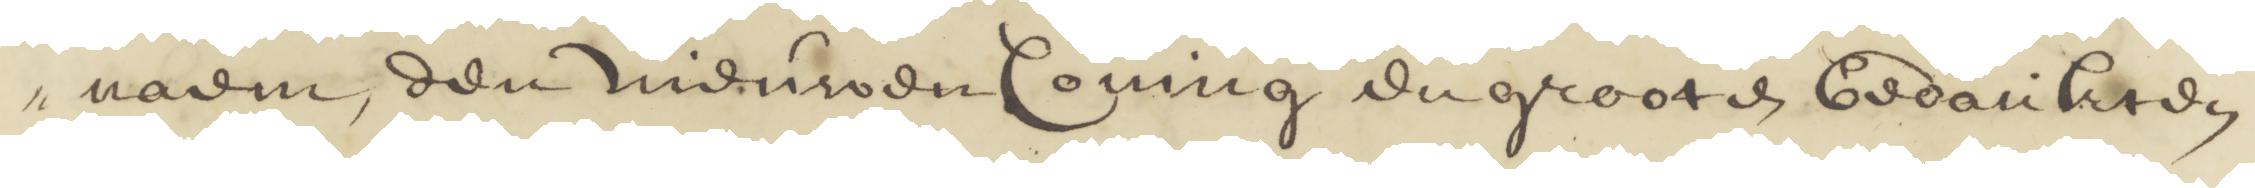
„naem, den nieuwen Coning en grooten bedankten
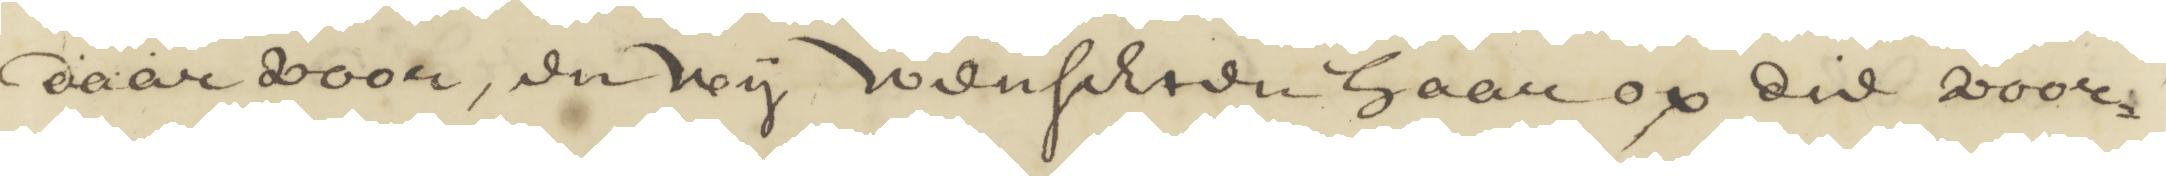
daar voor, en wij wenschten haar op die voor=
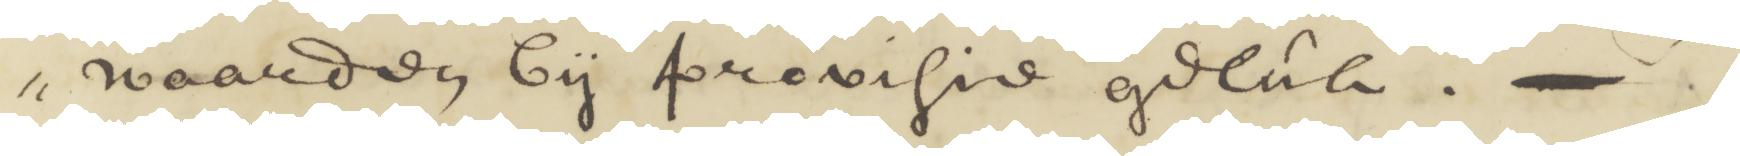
„waarden bij provisie geluk. —
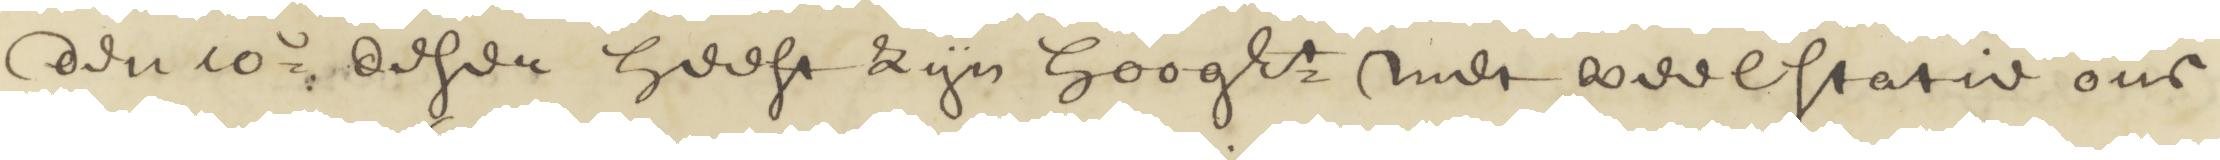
den 10=' deser heeft zijn hoogh=t met veel statie ons
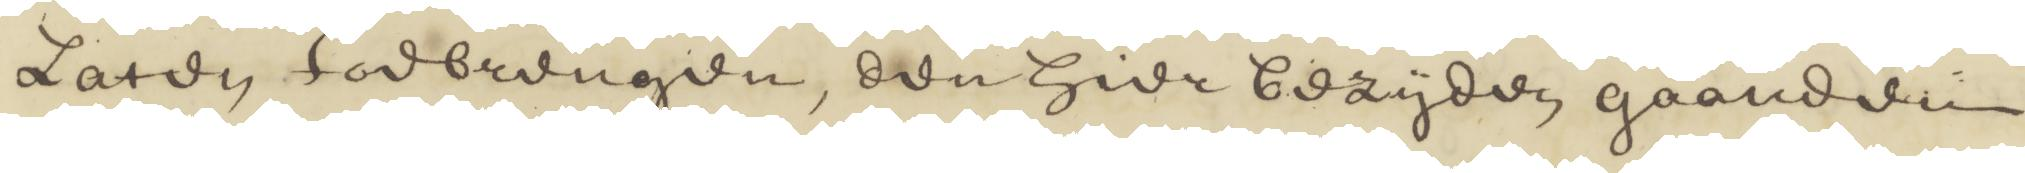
laten toebrengen, den hier bezijden gaanden
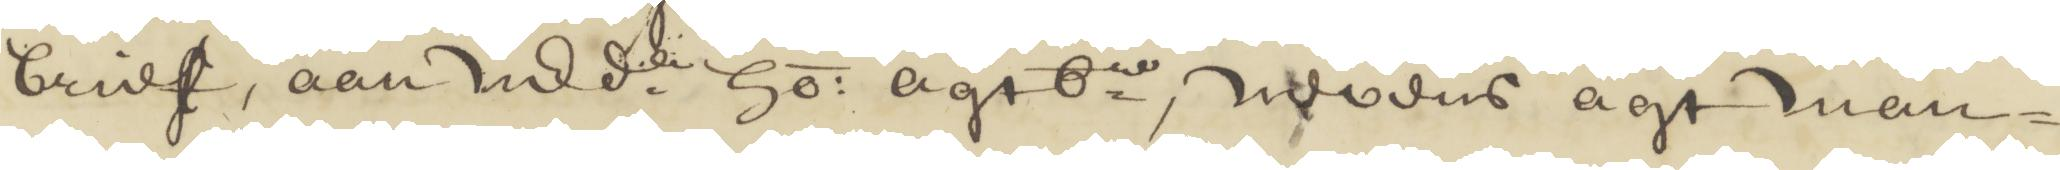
brief, aan uEd=le ho: agtb=re, nevens agt man=
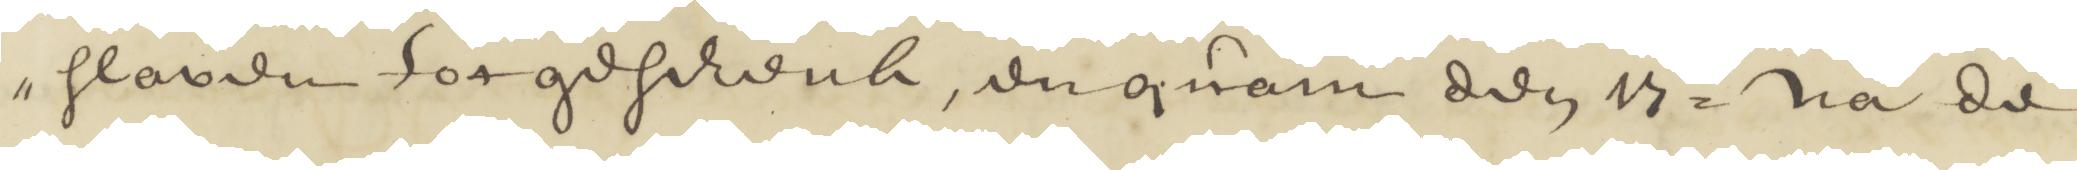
„slaven tot geschenk, en quam den 17=' na de
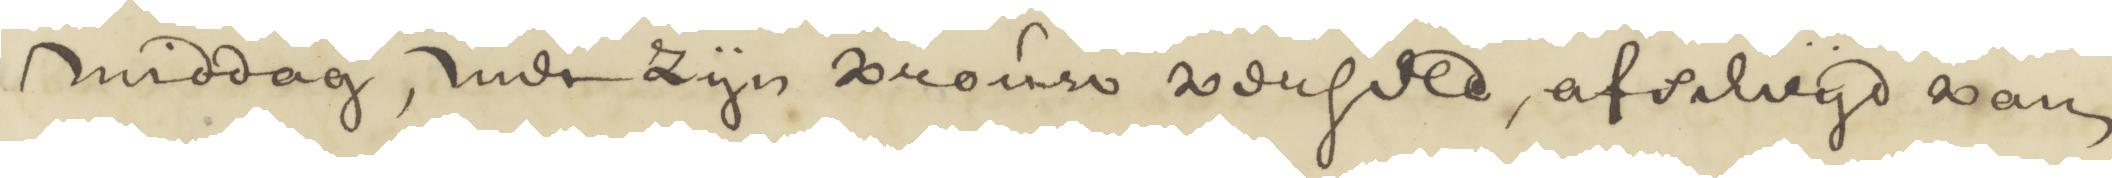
middag, met zijn vrouw verseld, afscheijd van
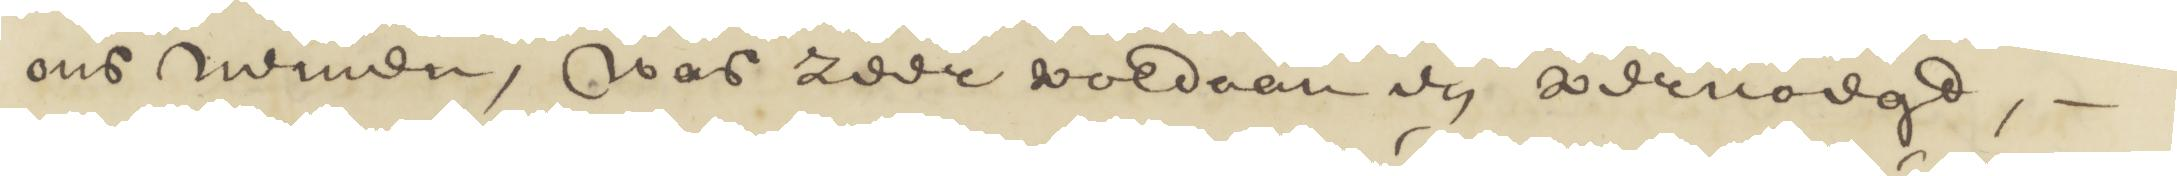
ons nemen, was zeer voldaan en vernoegd, —
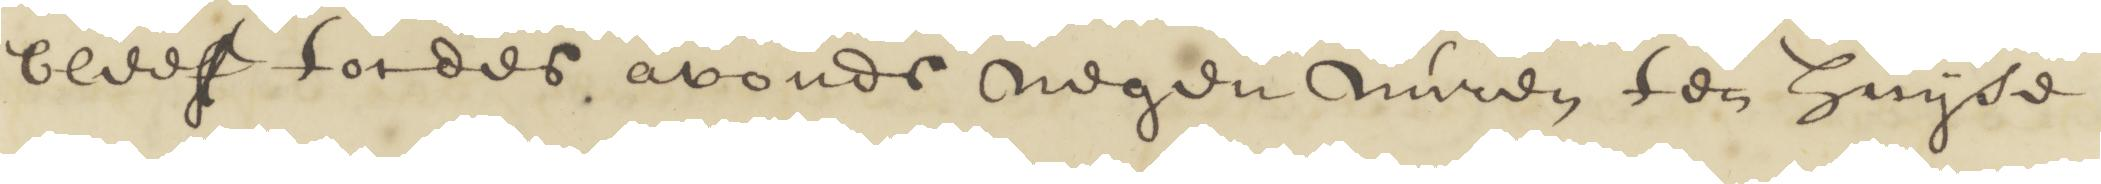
bleef tot des avonds negen uuren ten huijse
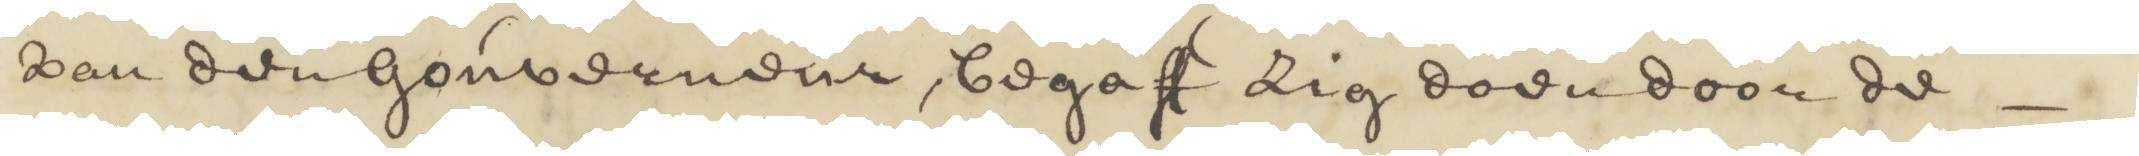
van den gouverneur, begaff zig doen door de —
